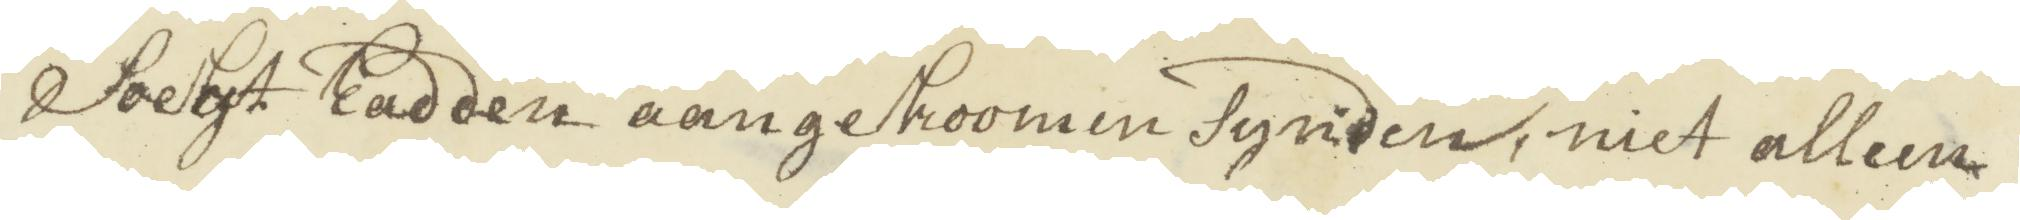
Soegt hadden aangekoomen synden, niet alleen
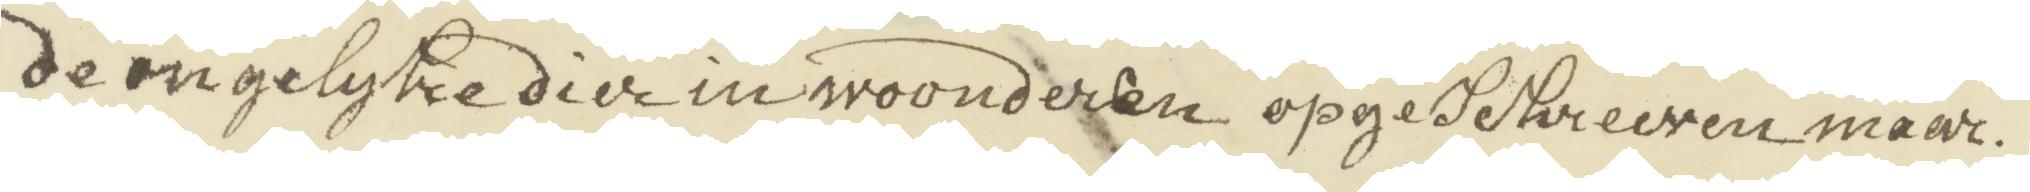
de ongelyke dier inwoonderen opgeschreeven maar.
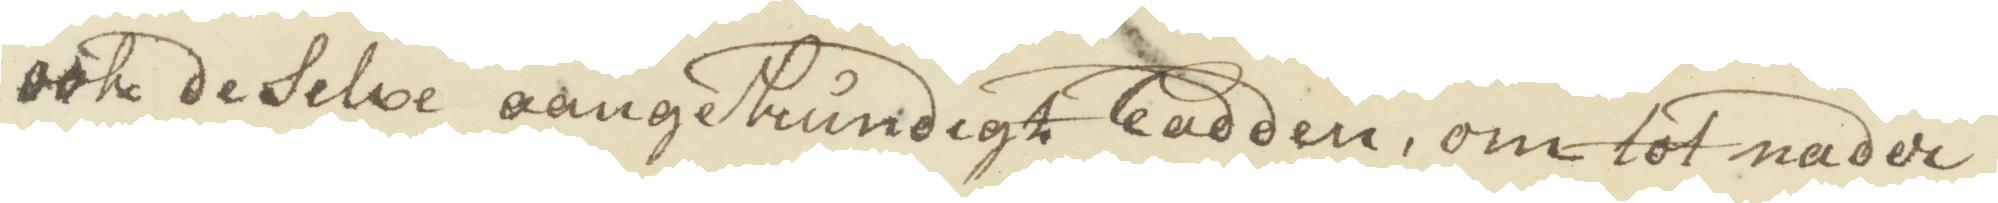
ook de selve aangekundigt hadden, om tot nader
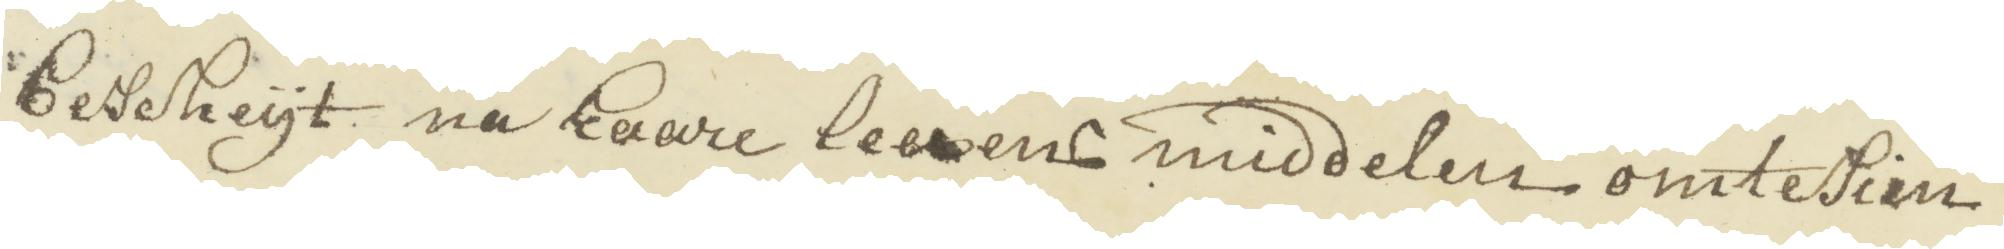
bescheijt na haare leevens middelen om te Sien
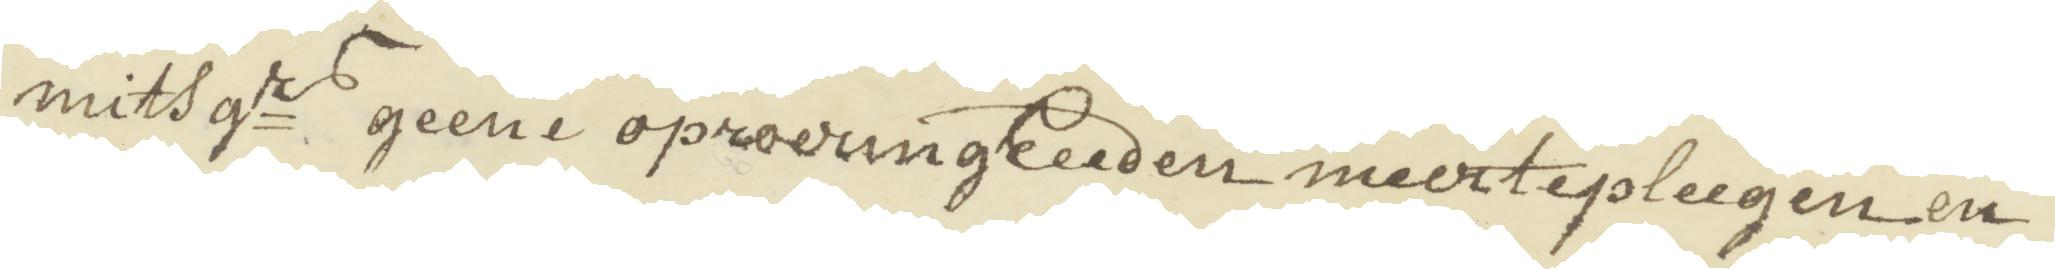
mitsgr=s geene oproeringheeden meer te pleegen en
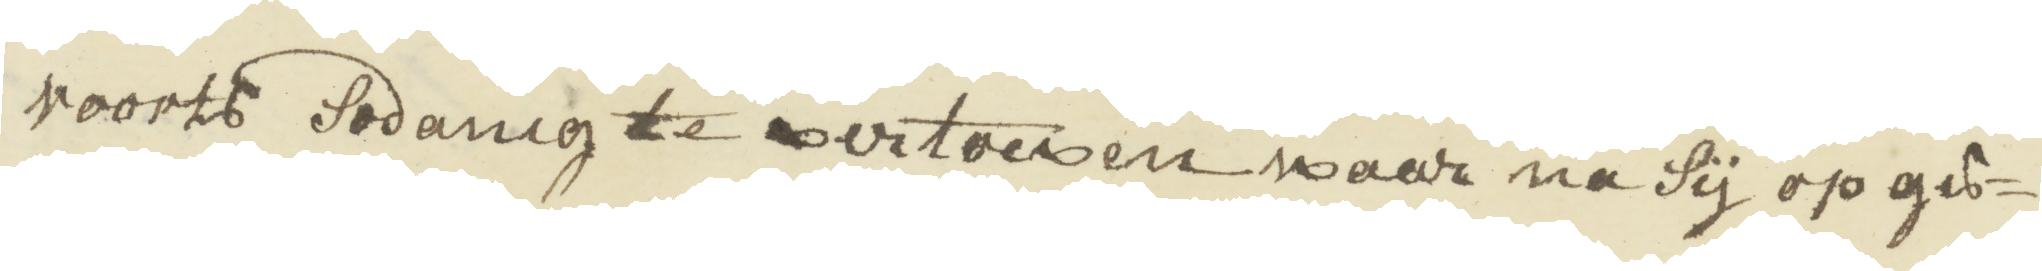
voorts Sodanig te vertoeven waar na Sij op gis=
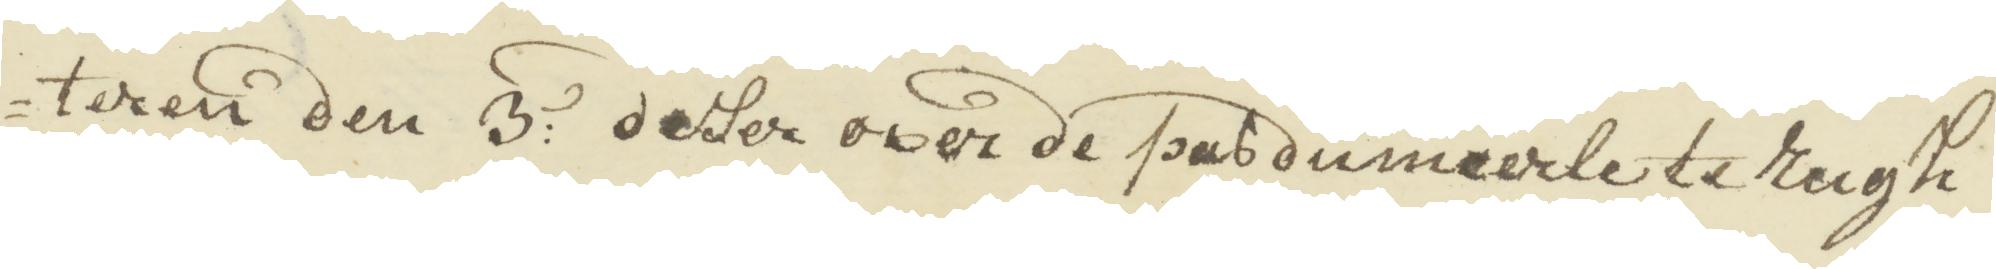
=teren den 3:e deser over de pas dumeerle terugh
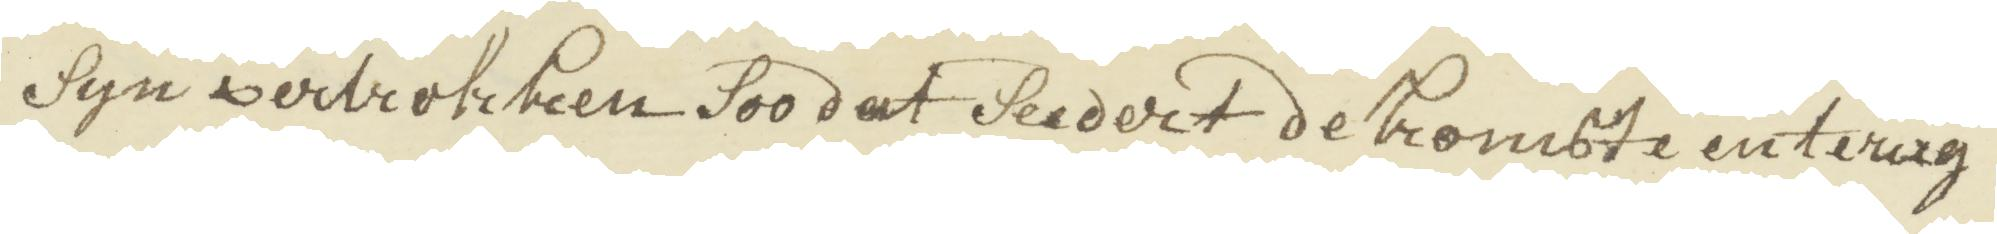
Syn vertrokken Soo dat Seedert de komste en terug
